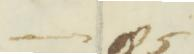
- 85
